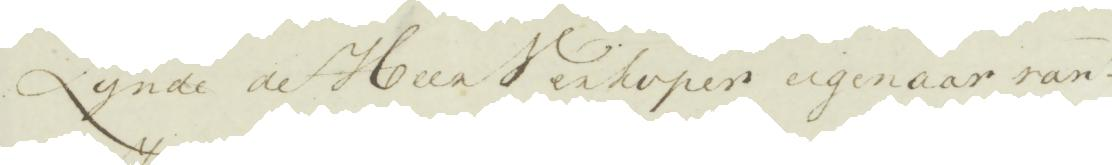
Zijnde de Heer Verkoper eigenaar van
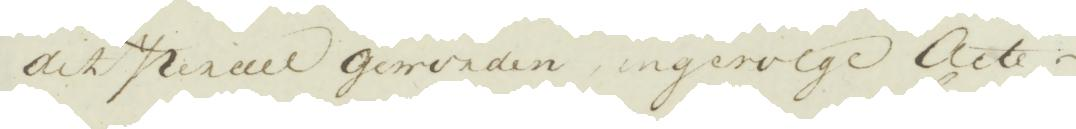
dit perceel geworden, ingevolge Acte
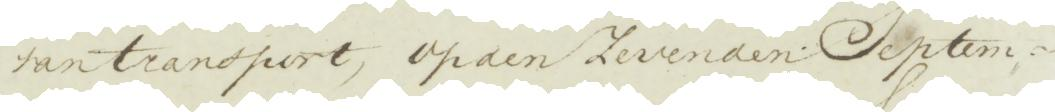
van transport, op den zevenden Septem„
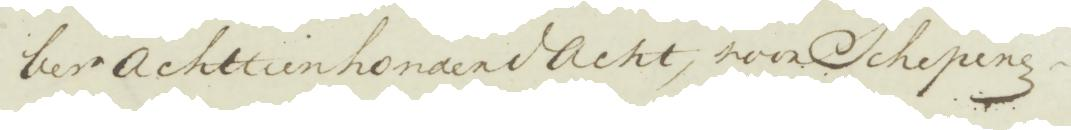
ber achttienhonderd Acht, voor Schepenen
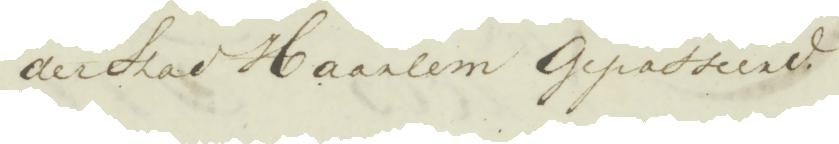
der stad Haarlem gepasseerd.
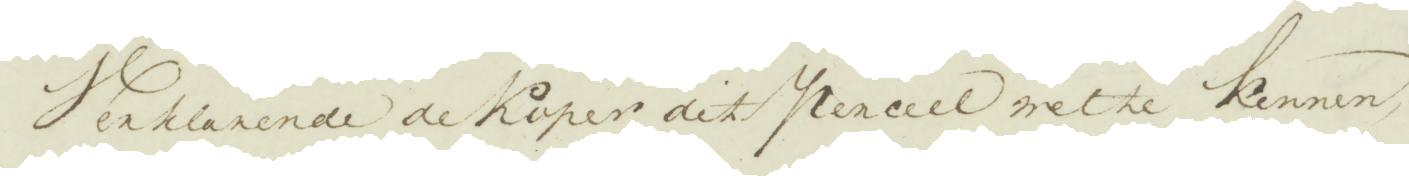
Verklarende de Koper dit perceel net te kennen,
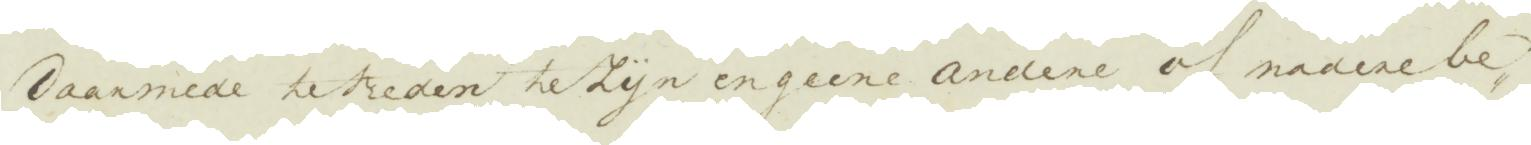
daarmede tevreden te zijn en geene andere of nadere be„
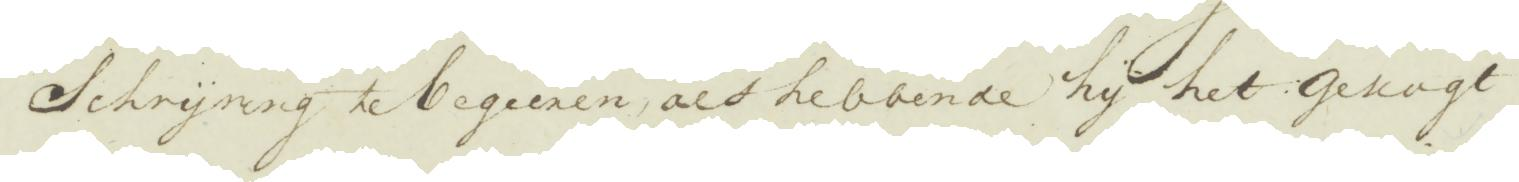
schrijving te begeeren, als hebbende hij het gekogt
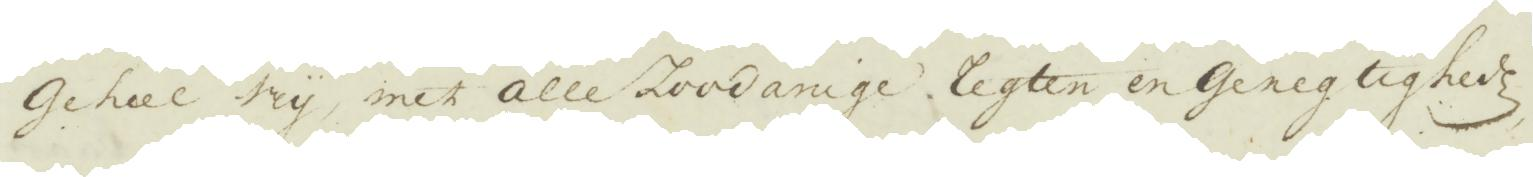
geheel vrij, met alle zoodanige regten en geregtigheden,
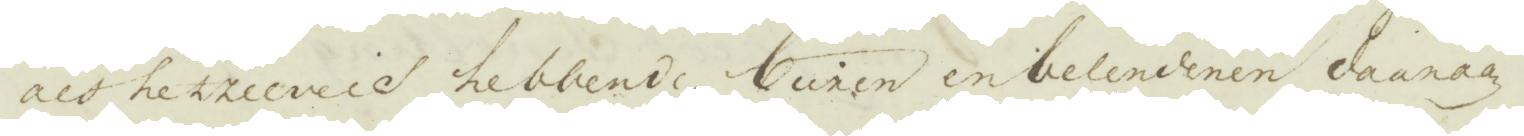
als het zelveis hebbende, buren en belendenen daaraan
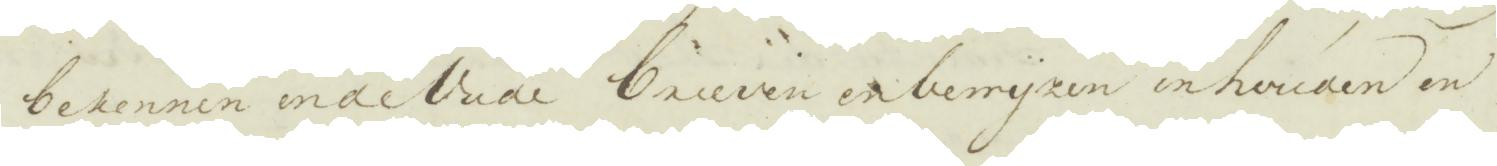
bekennen ende Oude brieven en bewijzen in houden en
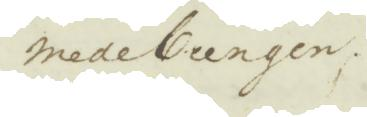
mede brengen.
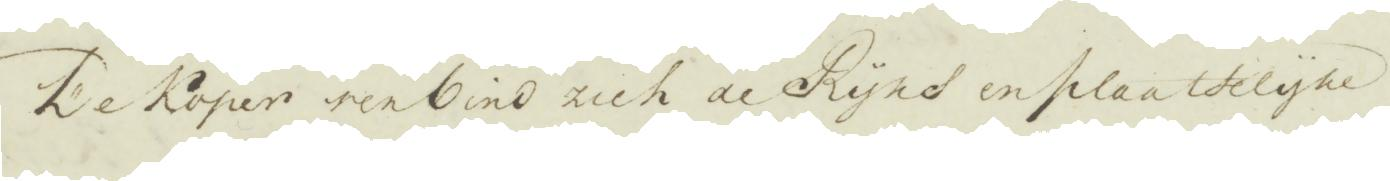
De Koper verbind zich de Rijns en plaatselijke
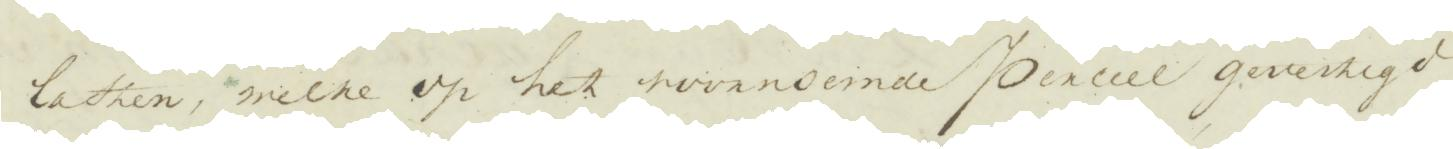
lasten, welke op het voornoemde Perceel gevestigd
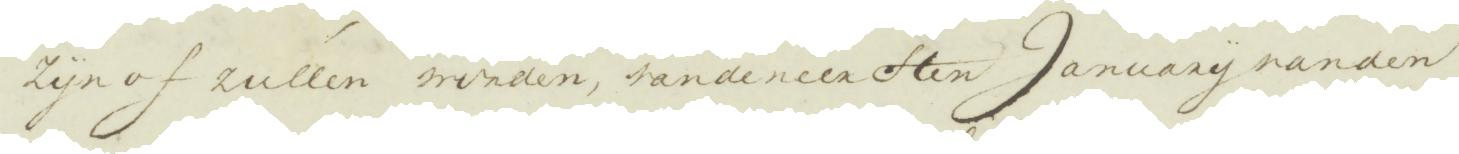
zijn of zullen worden, vandeneersten Januarij vanden
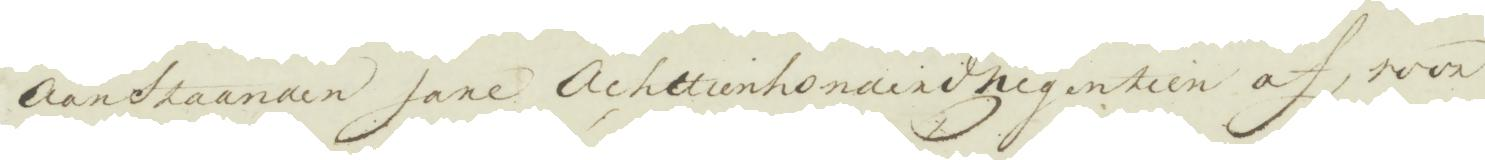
aanstaanden Jare Achttienhonderdnegentien af, voor
